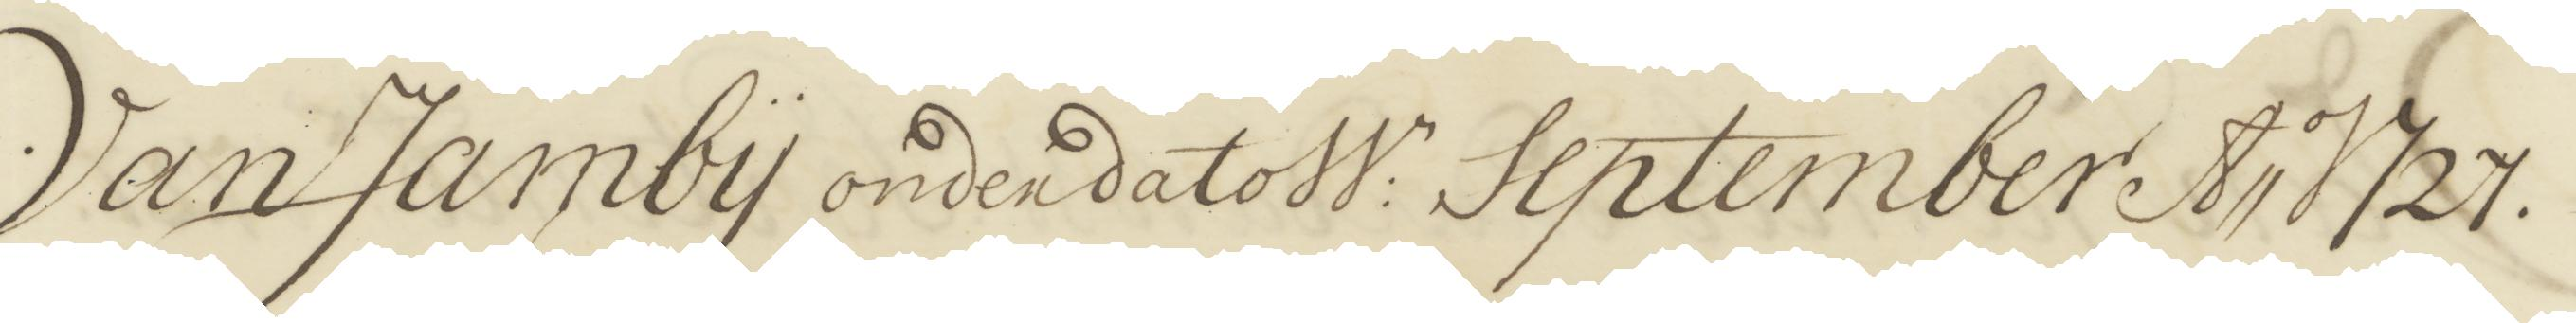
Van Jambij onder dato 11:e September A„o 1727.
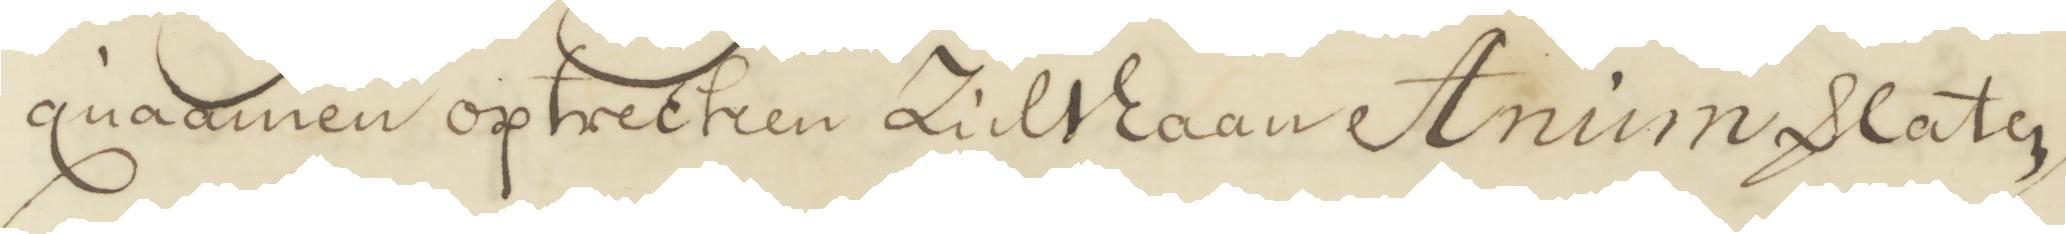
quaamen optrecken zulthaan Anum verlaten
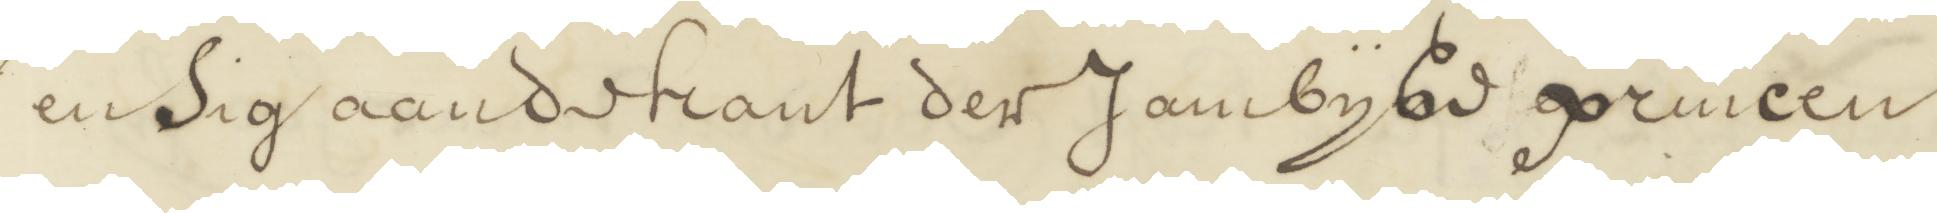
en sig aan de kant der Jambijse princen
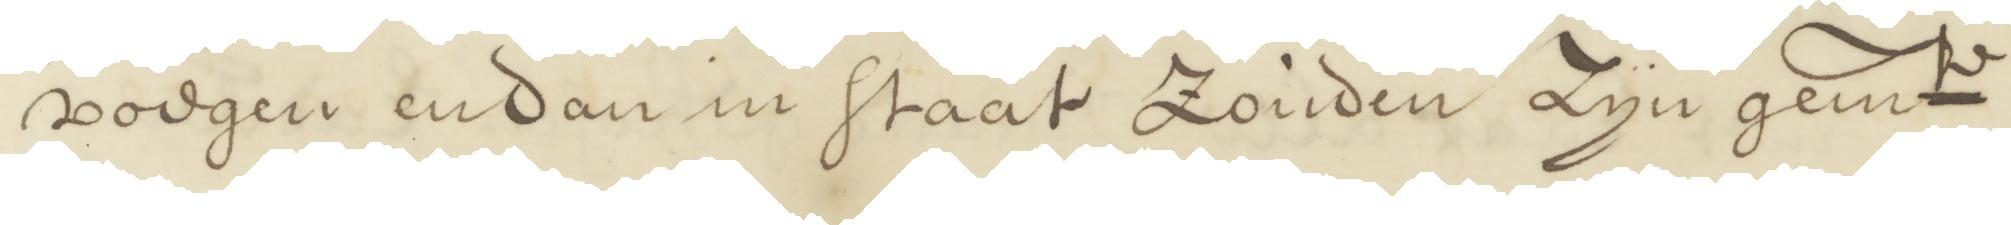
voegen en dan in staat zouden zijn gem:te
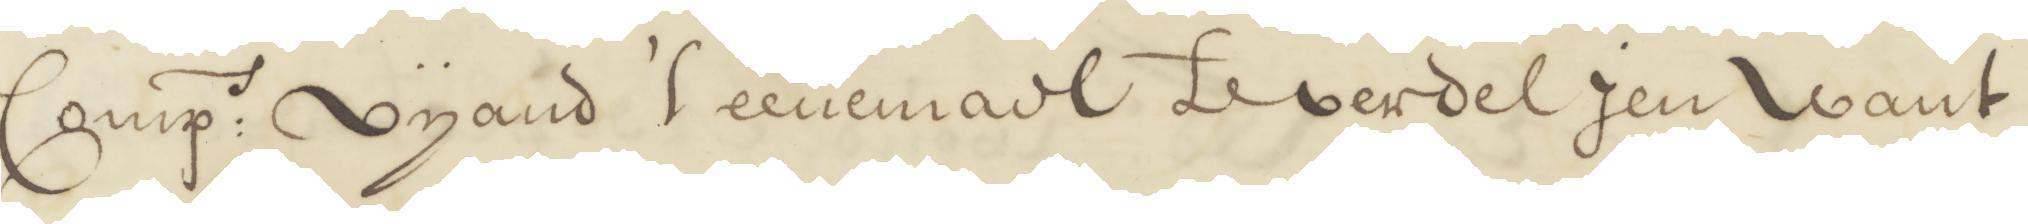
Comp:s vijand ’t eenemael te verdeljen want
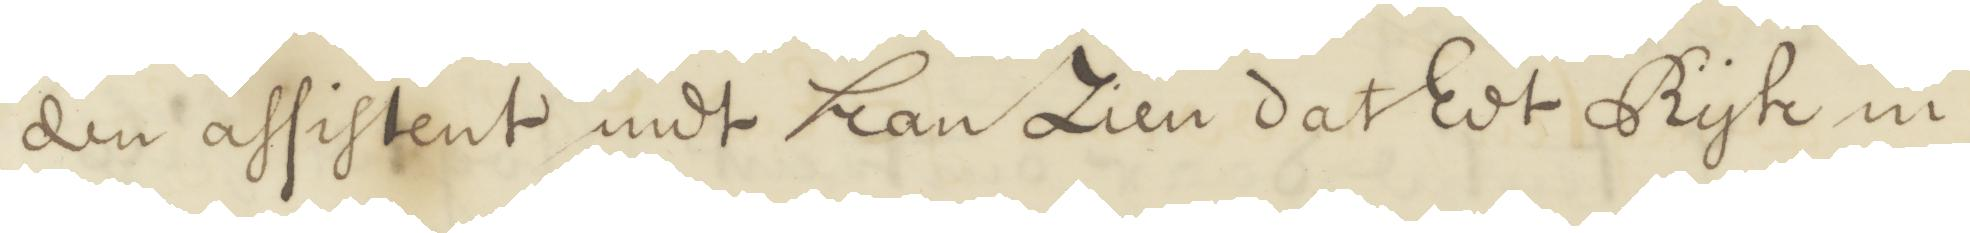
den assistent niet kan zien dat het Rijk in
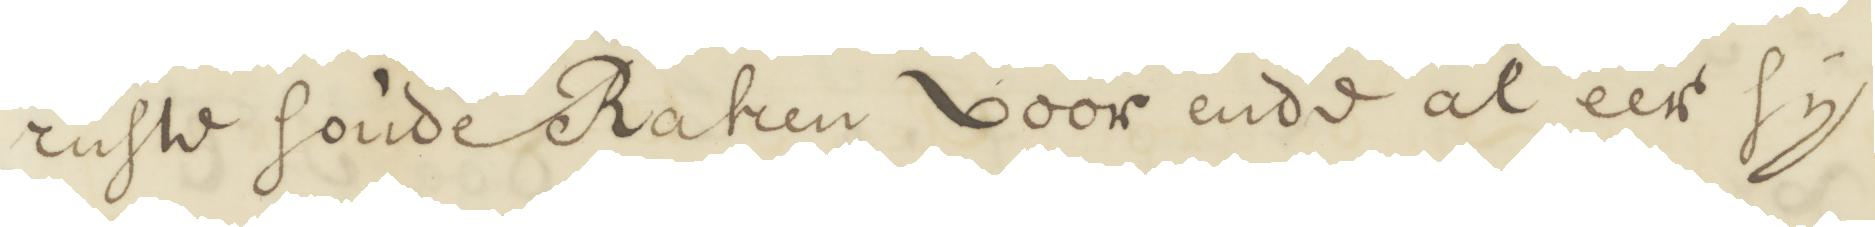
ruste soude Raken voor ende al eer sij
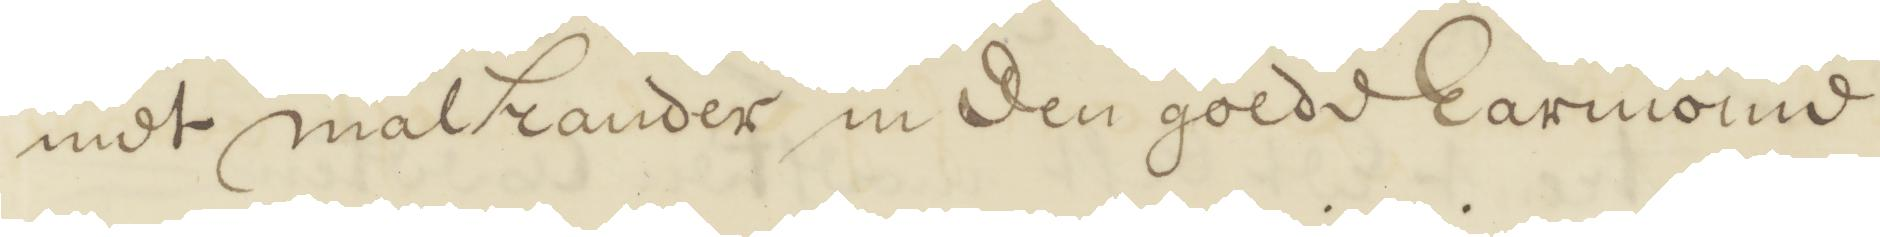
met malkander in Een goede harmonie
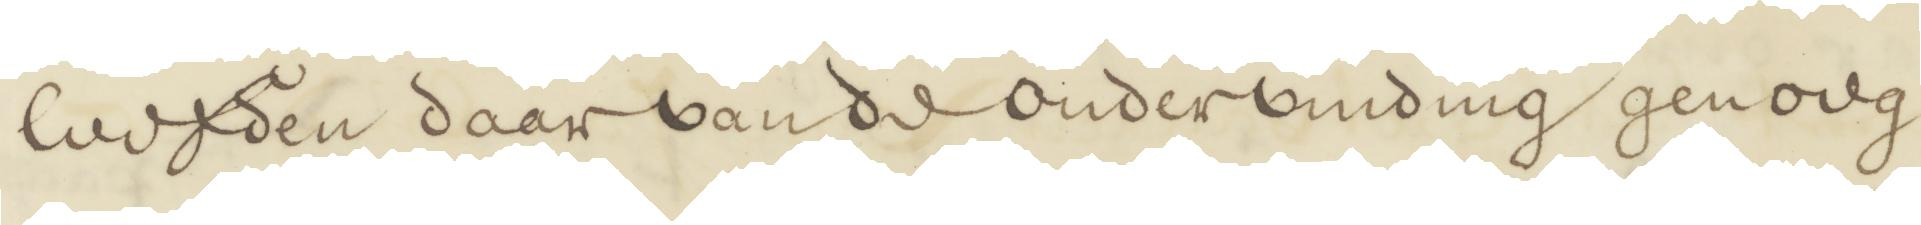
leefden daar van de ondervinding genoeg
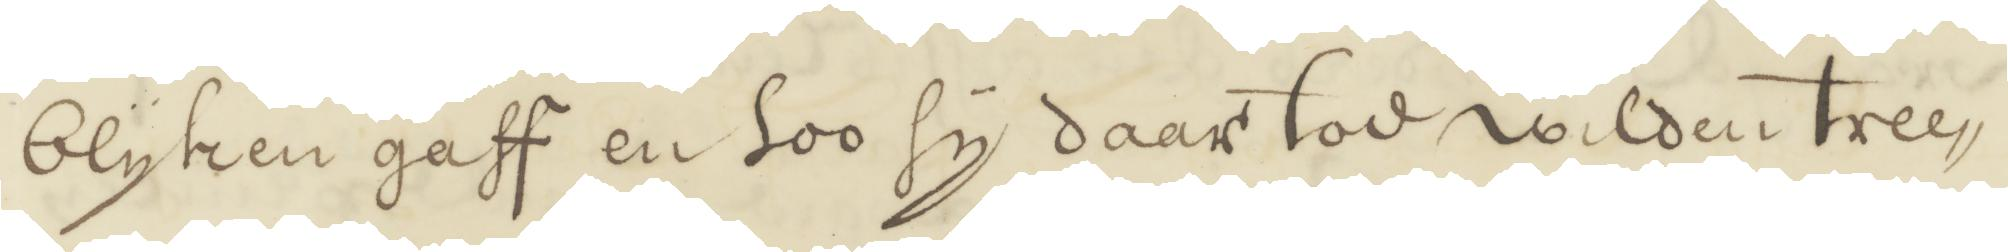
blijken gaff en soo sij daar toe wilden tree„
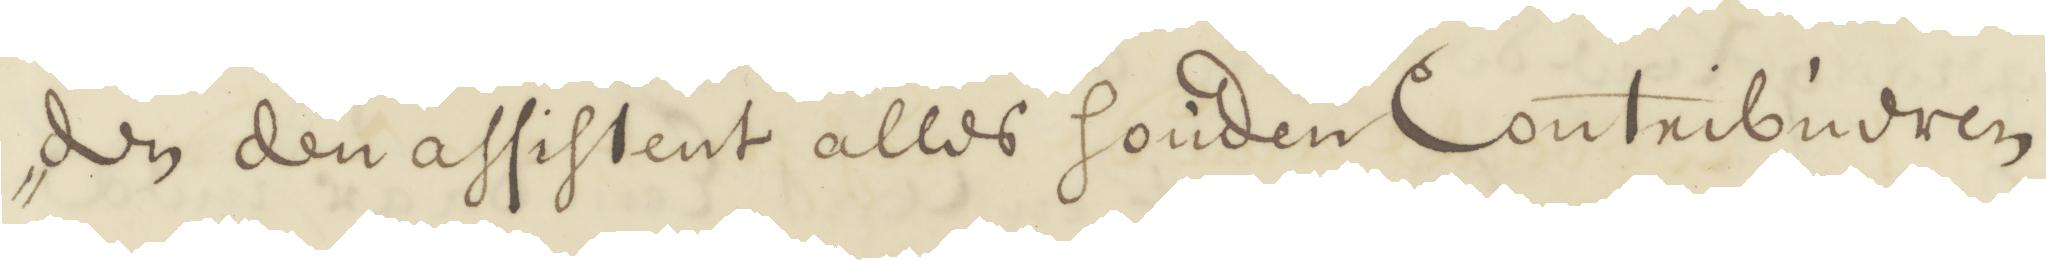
„den den assistent alles souden Contribueren
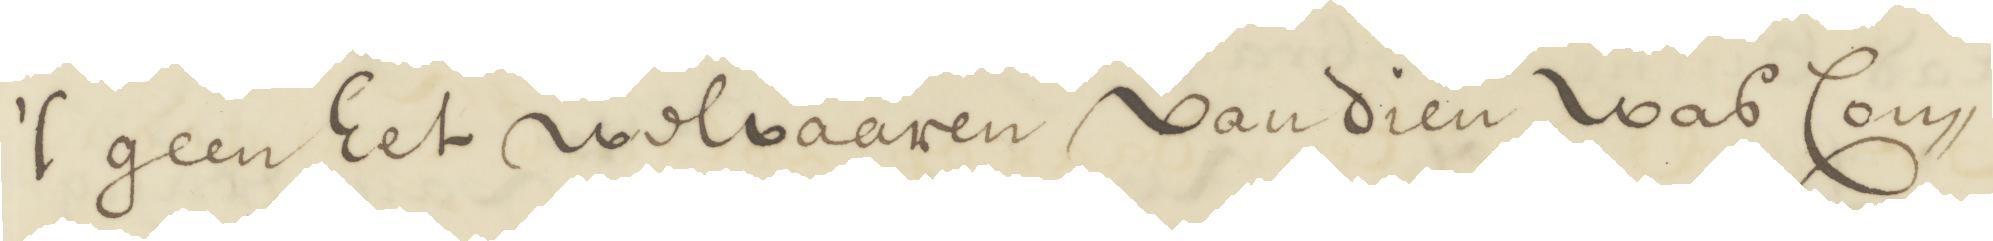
’t geen het welvaaren van dien was Con„
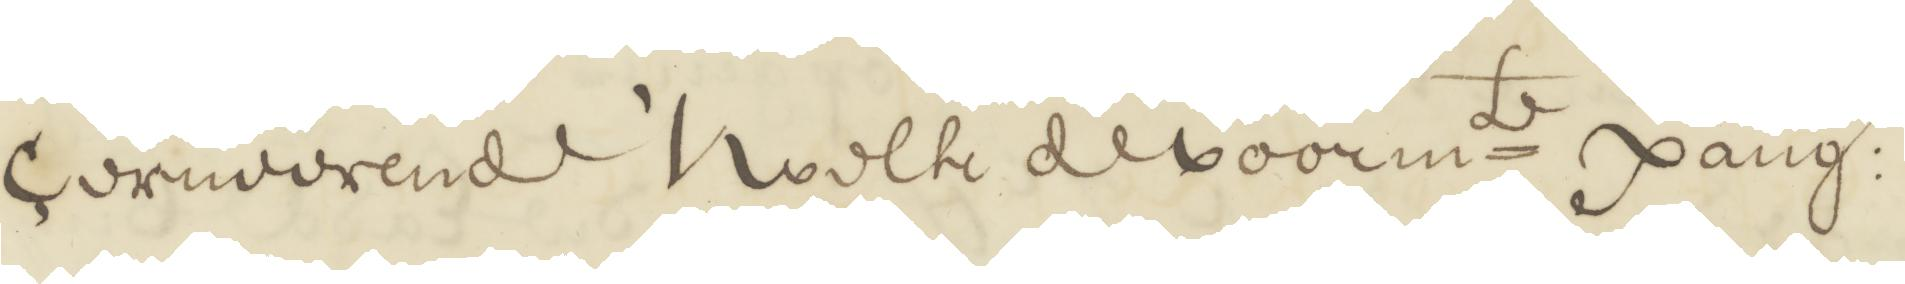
çerneerende 't welk de voorm:te pang:
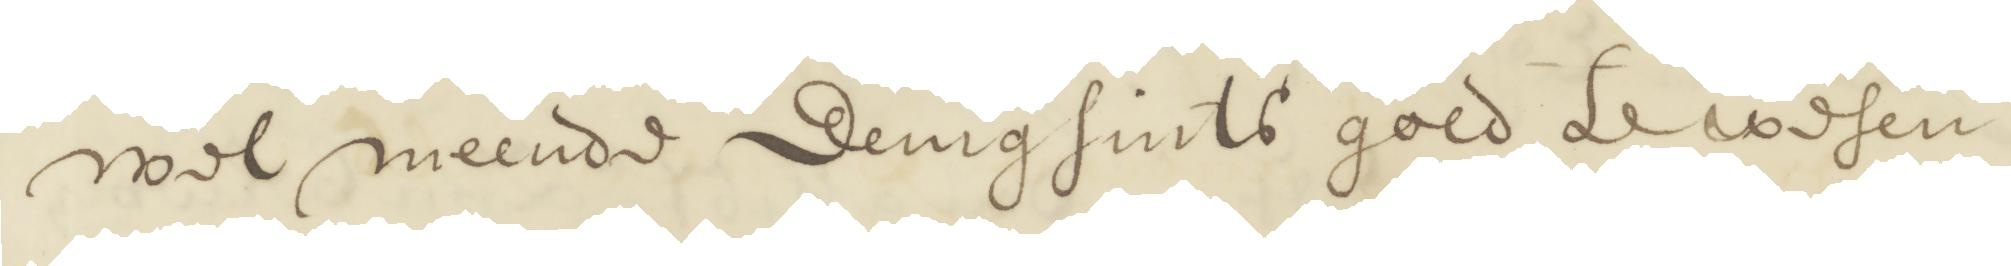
wel meende Eenigsints goed de wesen
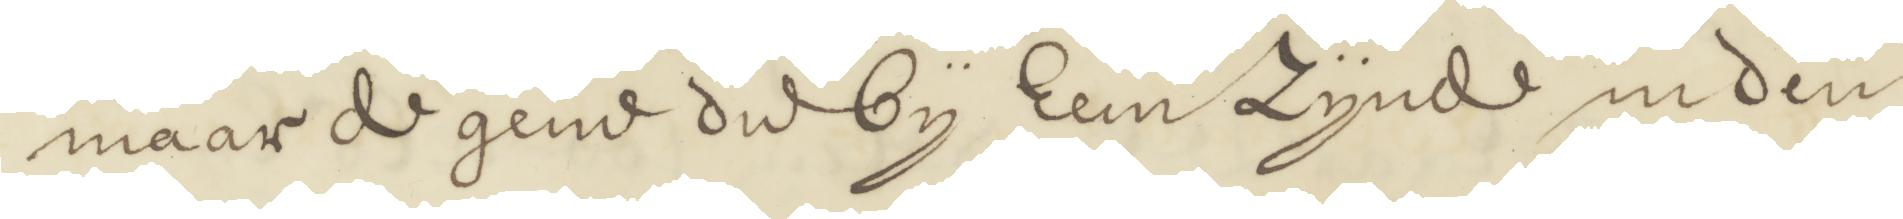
maar de gene die bij hem zijnde in den
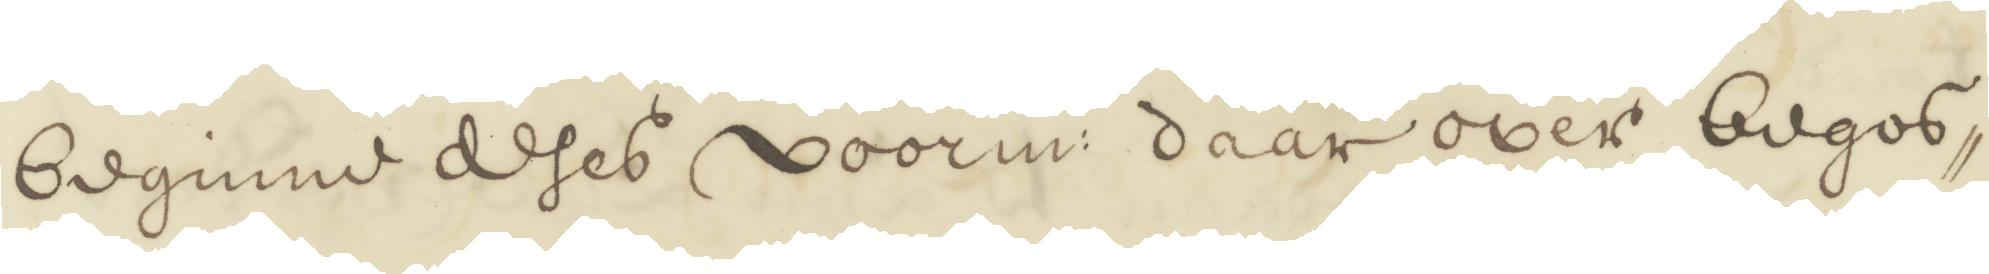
beginne deses voorm: daar over begos„
